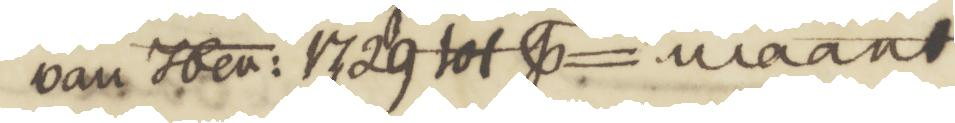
van 7ber: 1729 tot p=mo maart
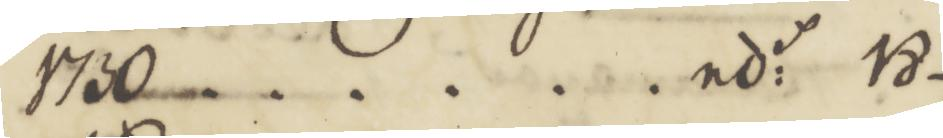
1730 - - - - - - rd:s 18—
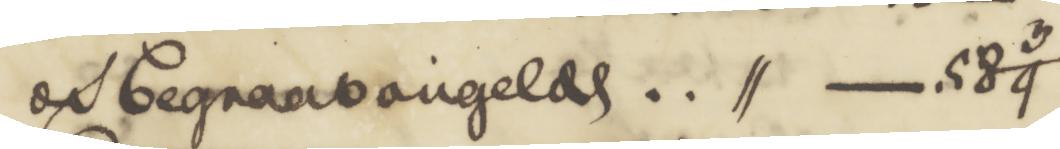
over begraavangelden - - „ —.58¾
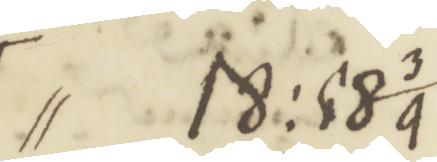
„ 18:58¾
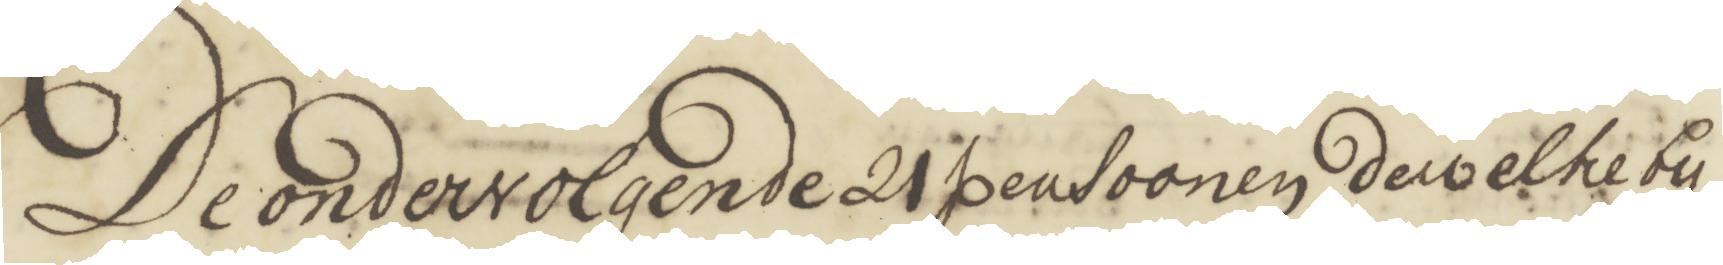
De ondervolgende 21 persoonen dewelke by
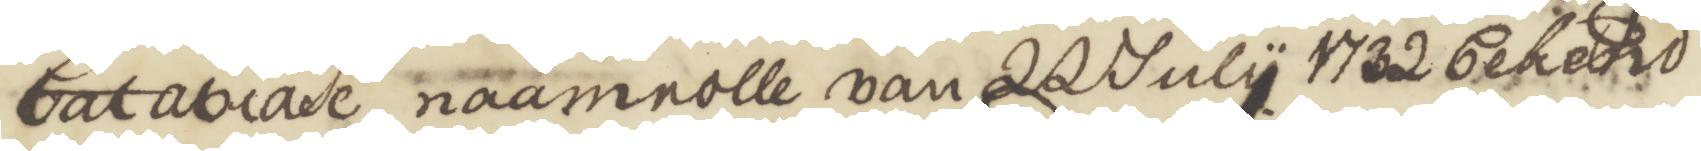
bataviase naamrolle van 22 Iulij 1732 bekend
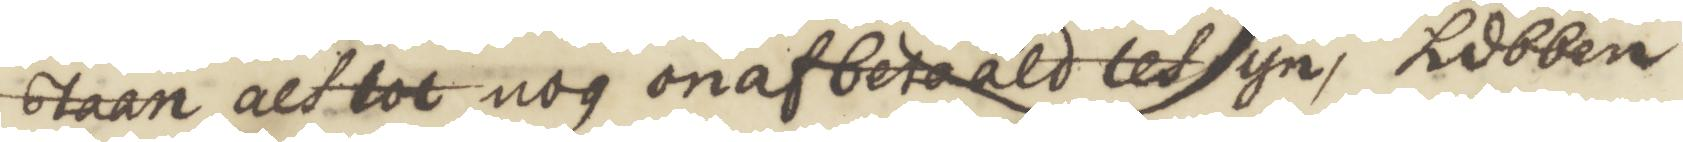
staan als tot nog onafbetaald tesijn, hebben
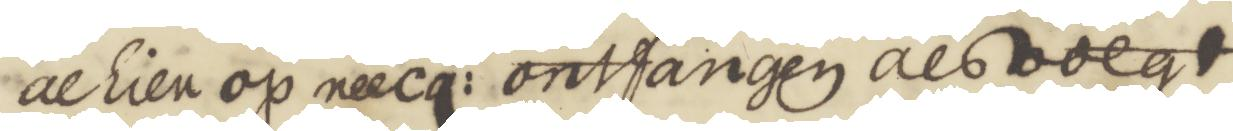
alhier op reecq: ontfangen als volgt
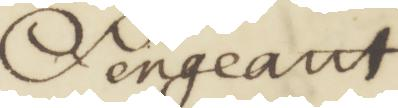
Sergeant
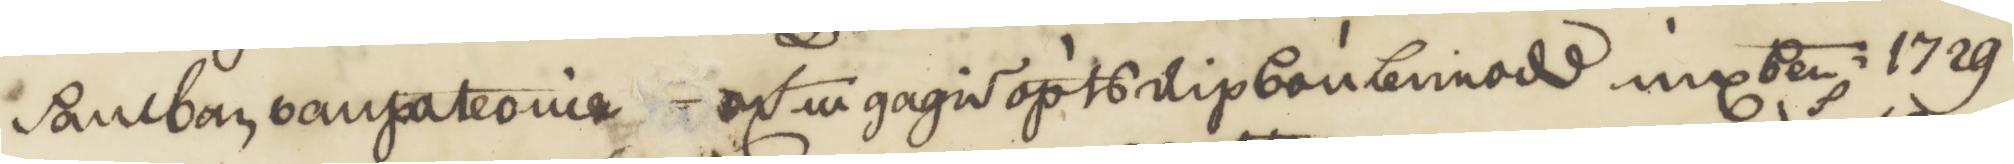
Samban vanpateonie over in gagie op'tschip boulevirade inxber: 1729
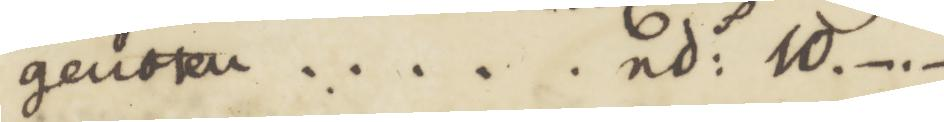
genoten - - - - - rd:s 10. —. —
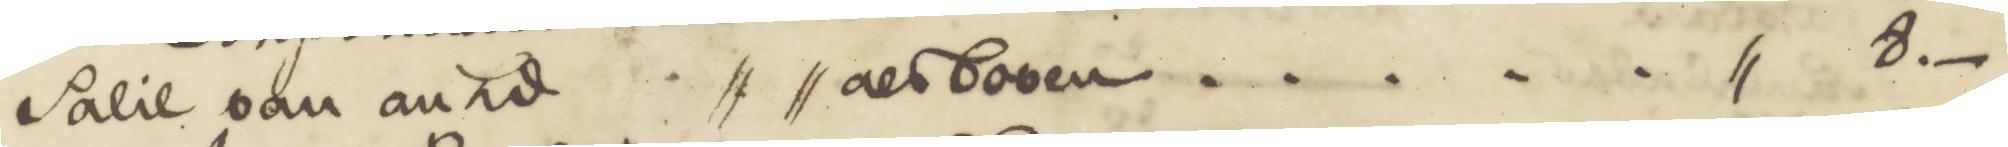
salil van anke „ „ als boven - - - - - „ 8. —
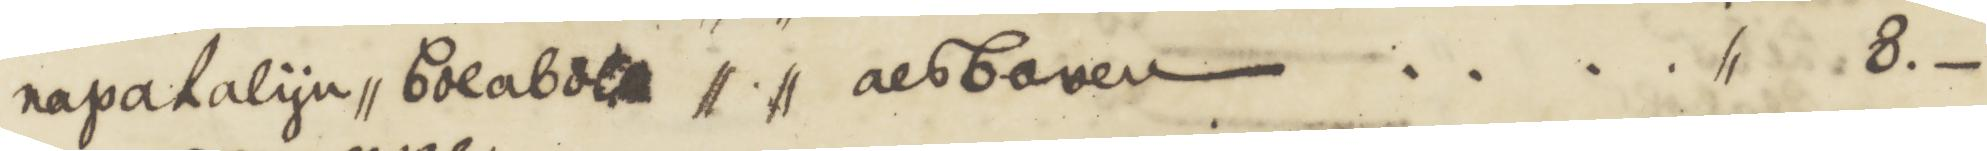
rapakalijn „ bolabele „ „ als boven - - - - „ 8. —
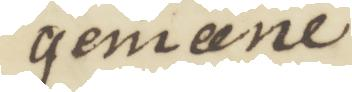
gemeene
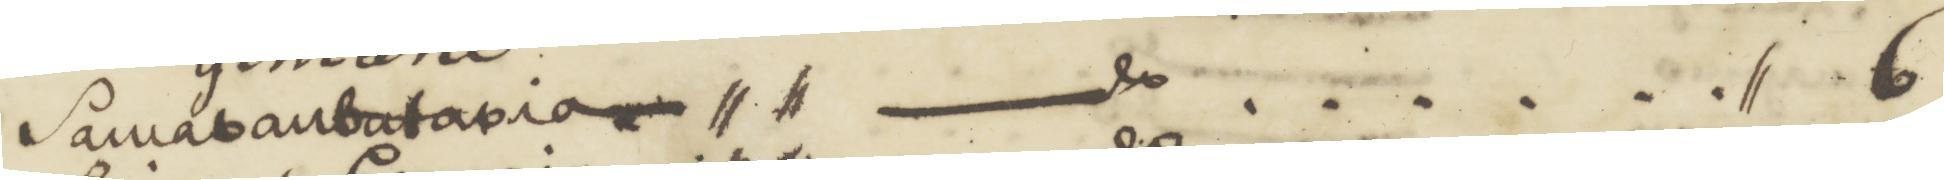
Samavanbatavia „ „ do - - - - - - „ 6
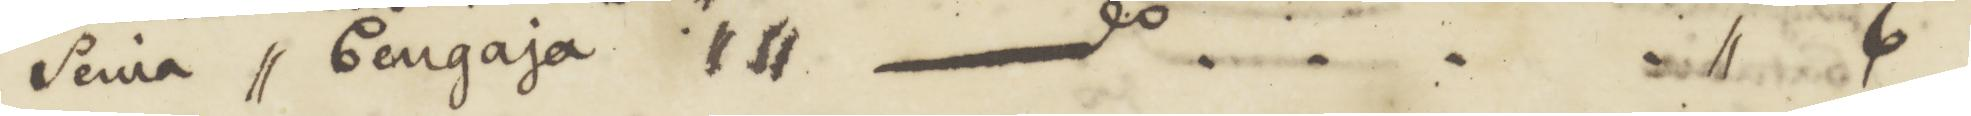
senia „ bengaja „ „ do - - - - „ 6
